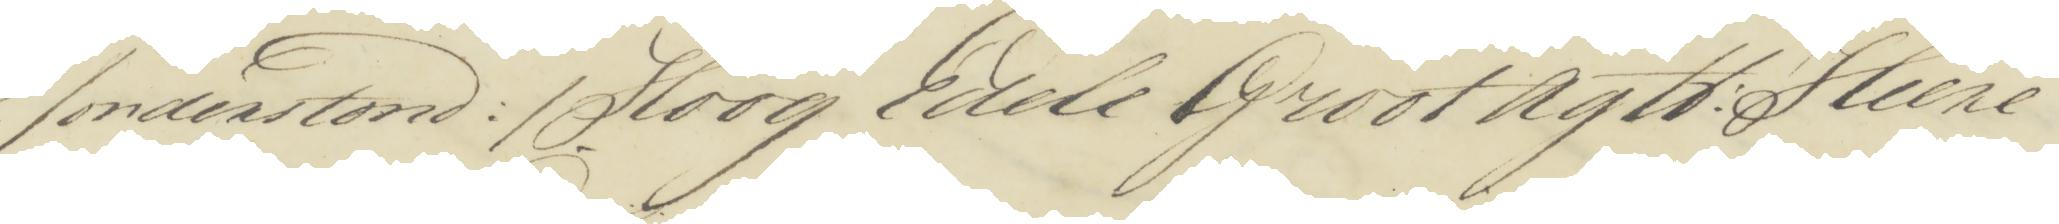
/onderstond :/ Hoog Edele Groot Agtb: Heere
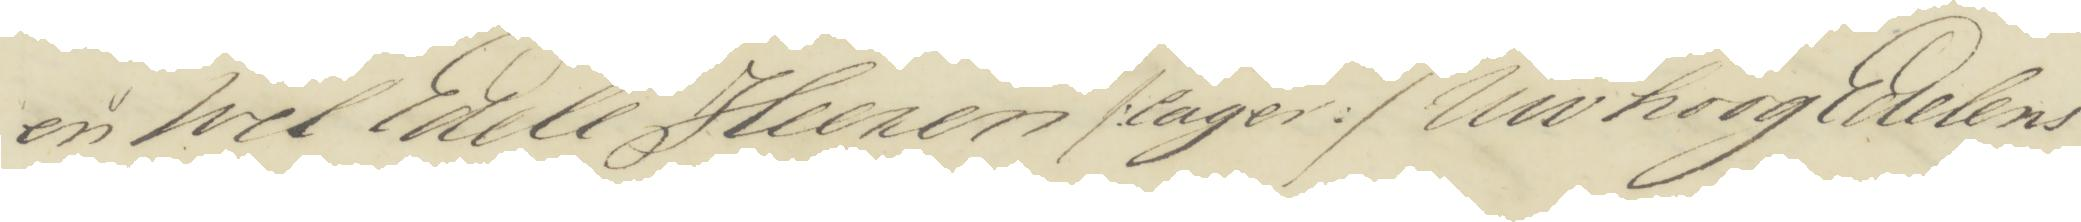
en Wel Edele Heeren /:lager:/ uw hoog Edelens
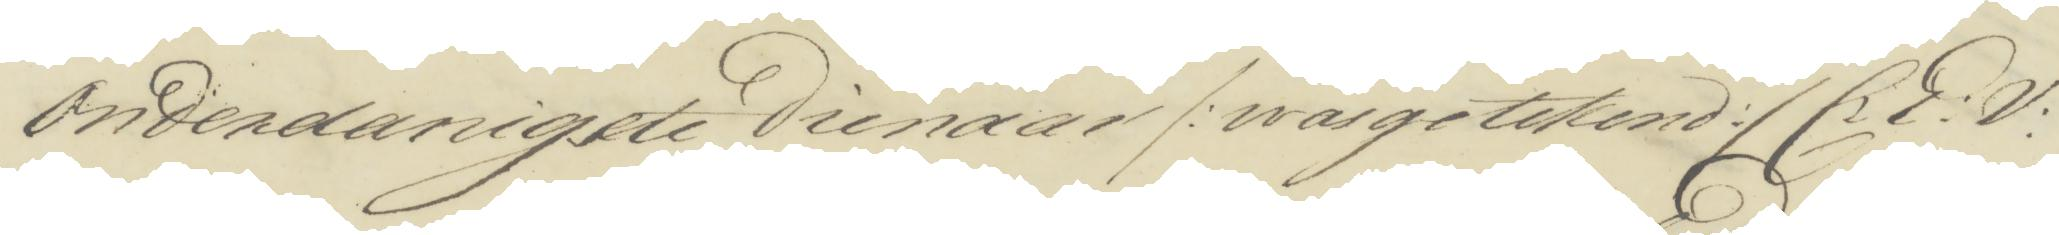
onderdanigste dienaar /:was getekend:/ C E: v:
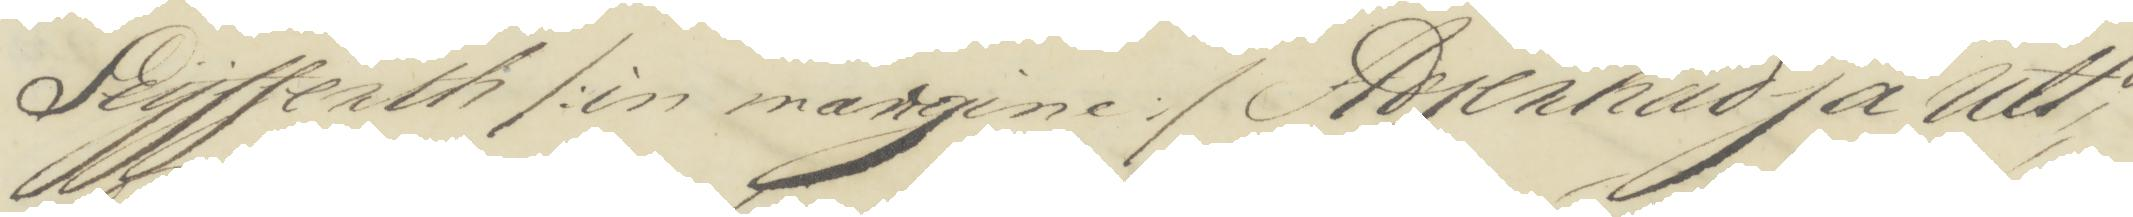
Seijfferth /:in margine:/ Adjerhadja ult„o
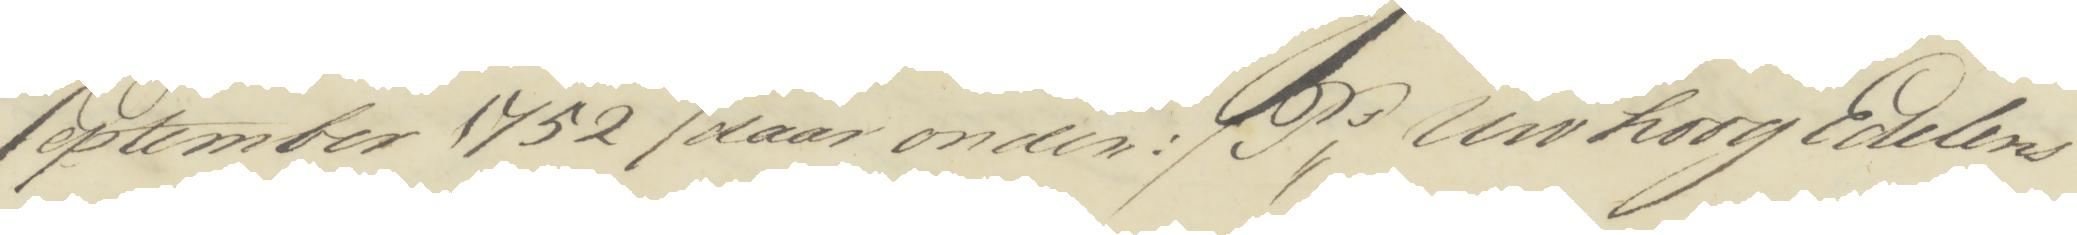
september 1752 /daar onder:/ P„s uw hoog Edelens
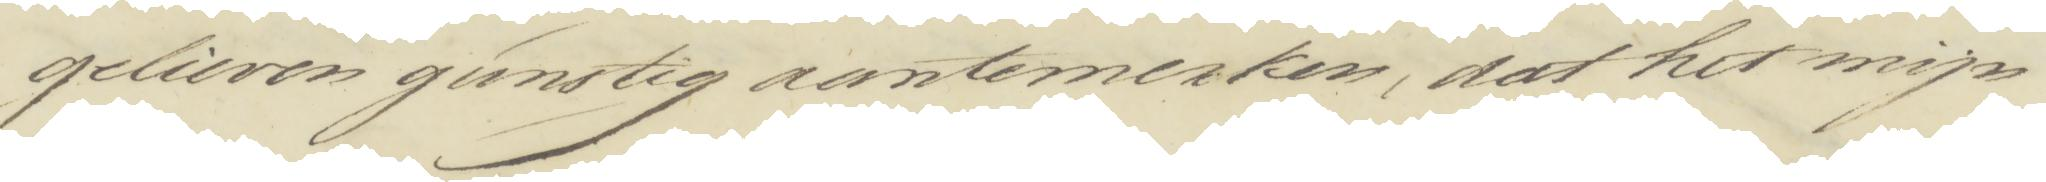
gelieven gunstig aantemerken, dat het mijn
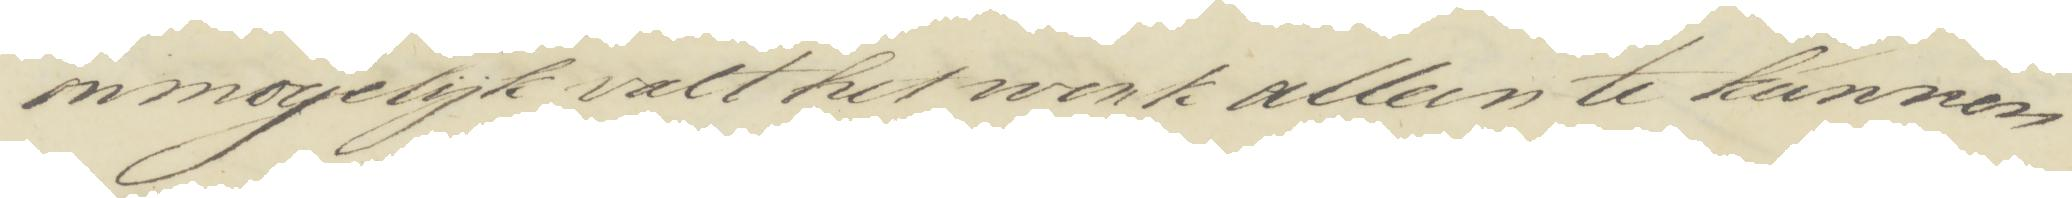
onmogelijk valt het werk alleen te kunnen
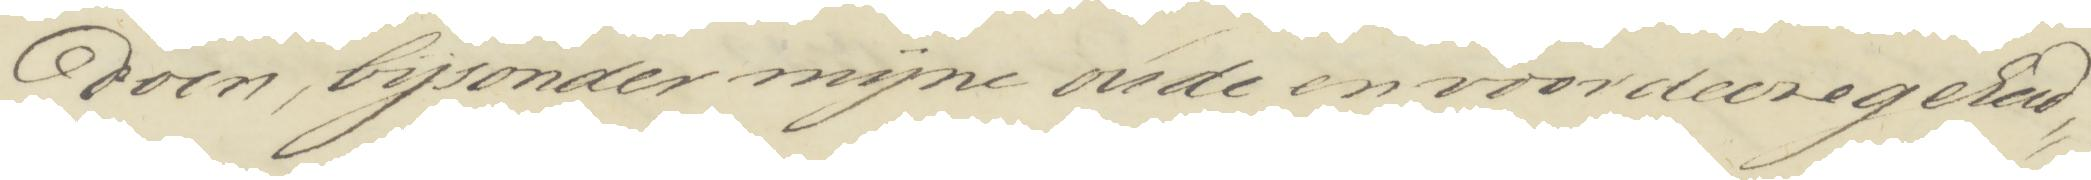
doen, bijsonder mijne oude en voor deeze gehad„
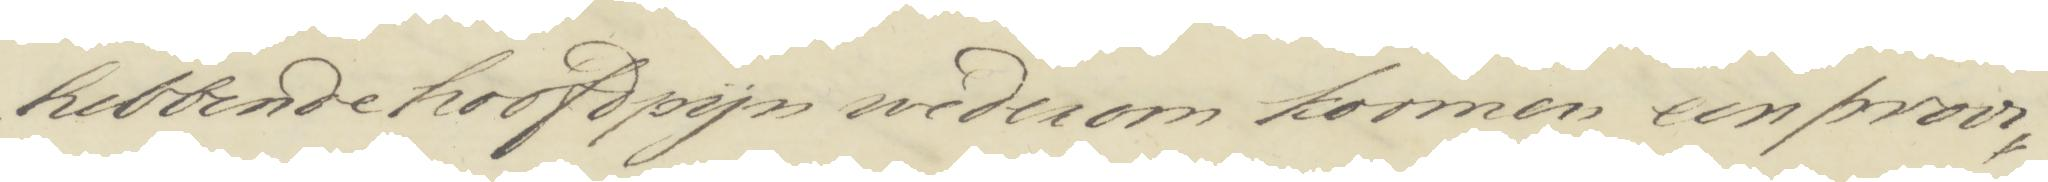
hebbende hoofdpijn wederom koomen een provi„
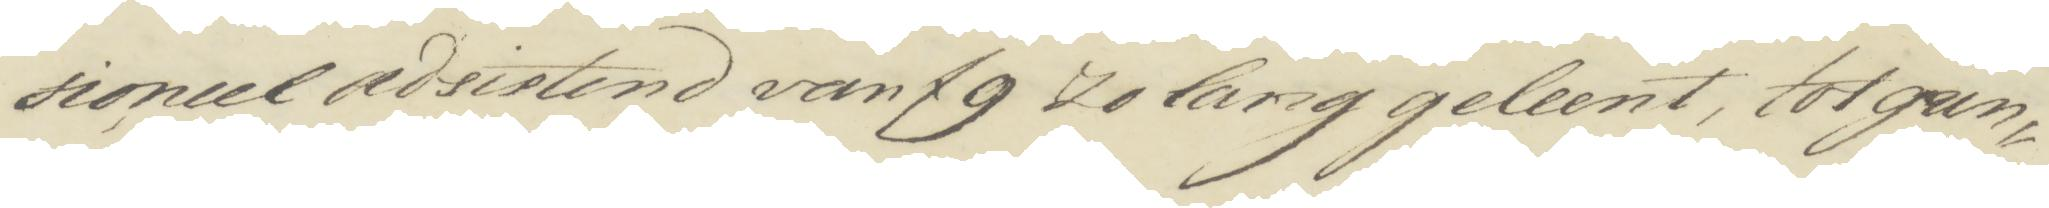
sioneel adsistend van ƒ9 zo lang geleent, tot gun„
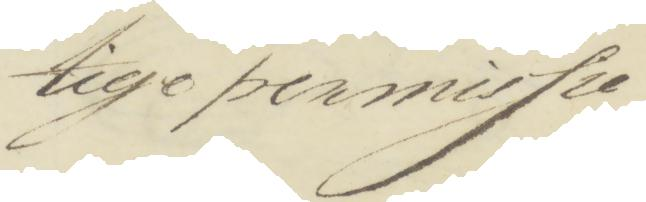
tige permissie
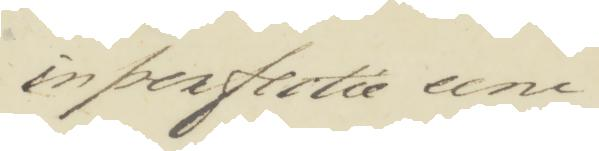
in perfectie eene
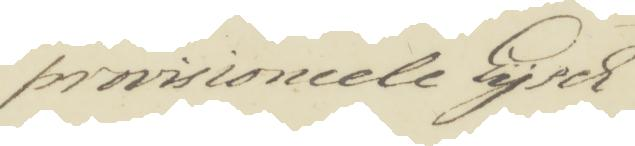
provisioneele Eijsch
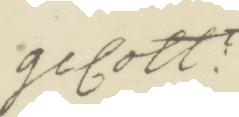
gecoll:t
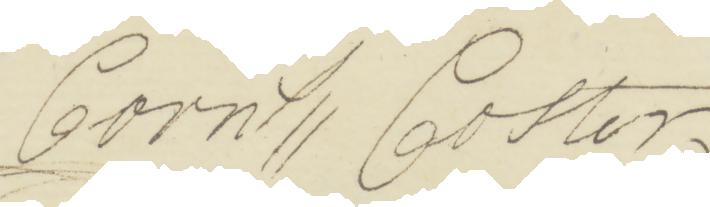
Corn„s Coster
